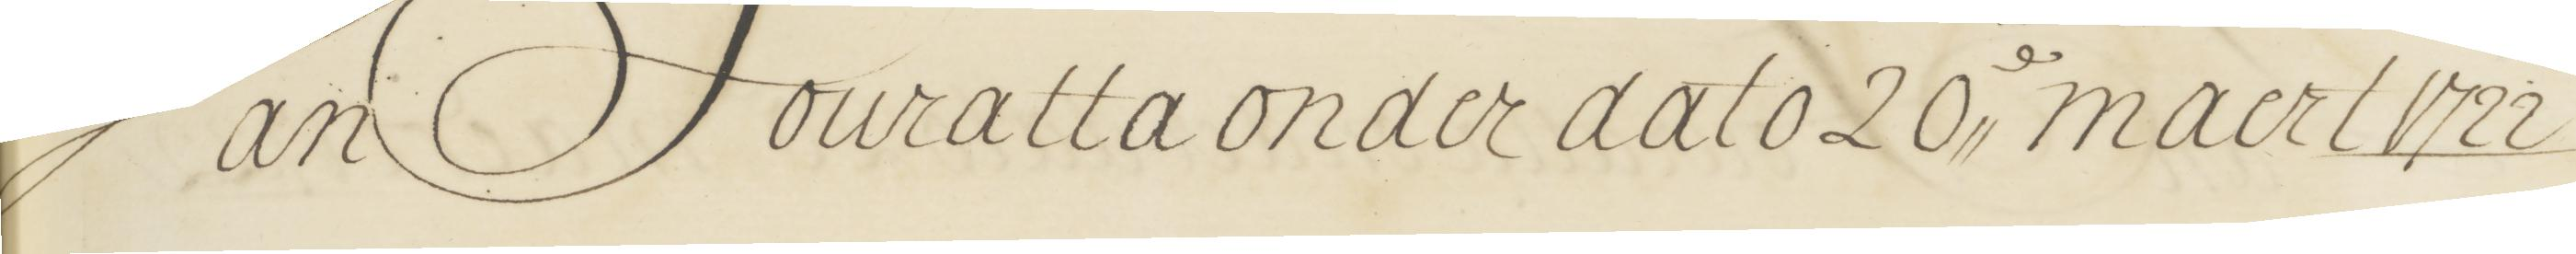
Van Souratta onder dato 20„e maert 1722
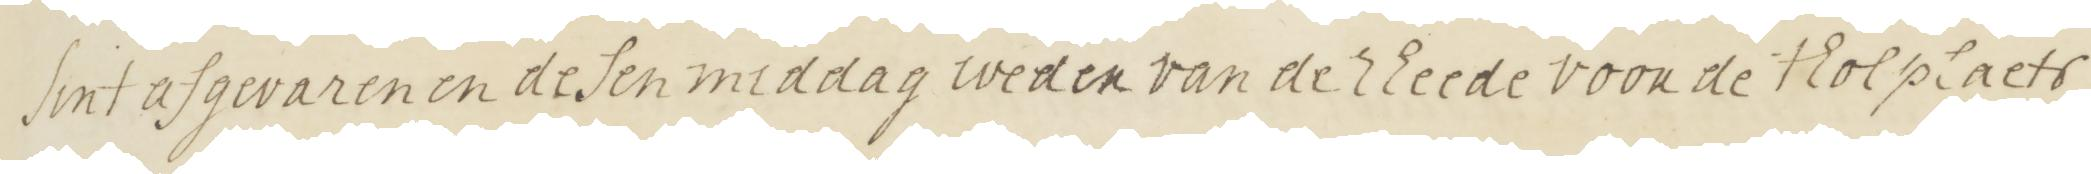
sint afgevaren en desen middag weder van de Rheede voor de Holplaets
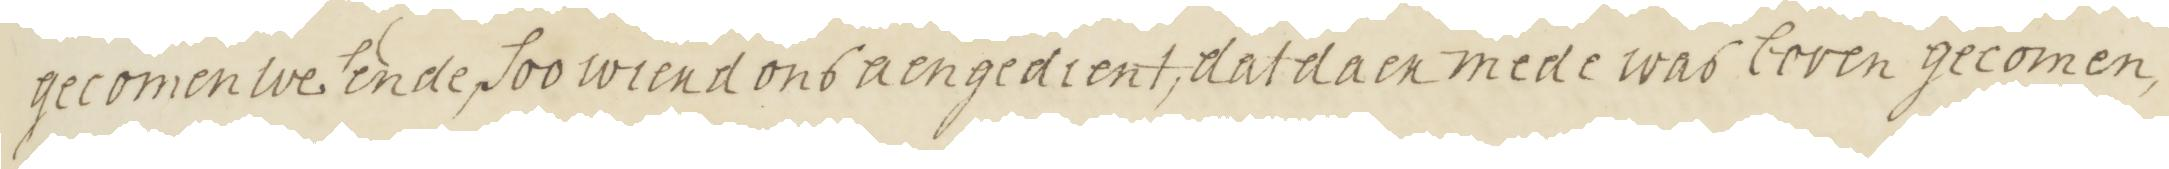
gecomen we sende, soo wierd ons aen gedient, dat daer mede was boven gecomen,
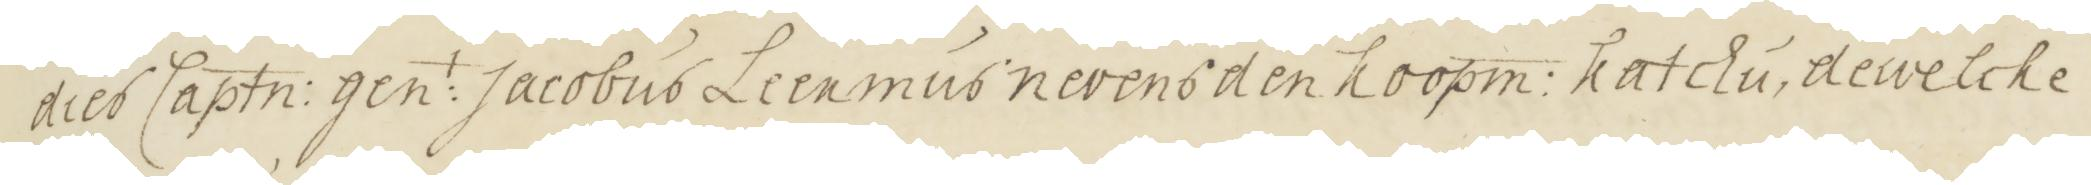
dies Captn: gen:t Jacobus Leermus nevens den koopm: katchu, dewelcke
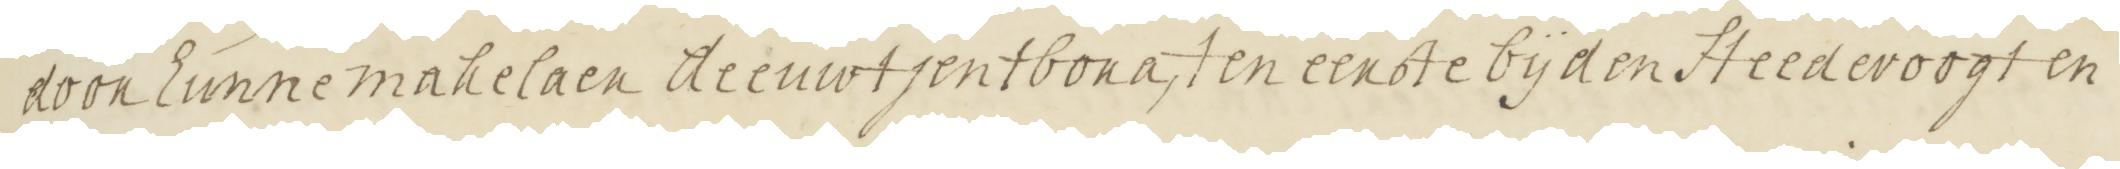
door hunne makelaer deeuwtjentbora, ten eerste bij den Heedevoogt en
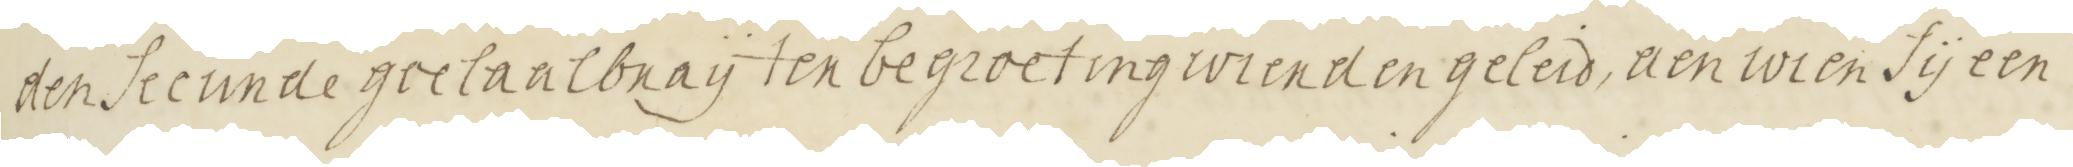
den Secunde goelaalbraij ter begroeting wierden geleid, aen wien sij een
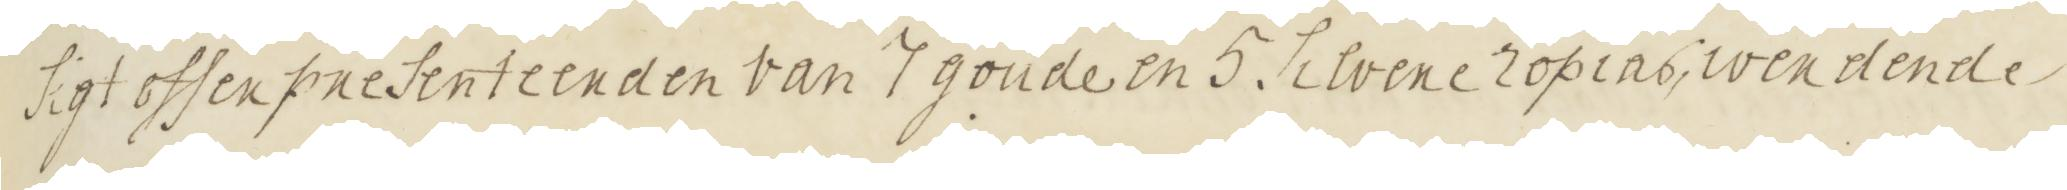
sigt ofser presenteerden van 7 goude en 5 silvere ropias, werdende
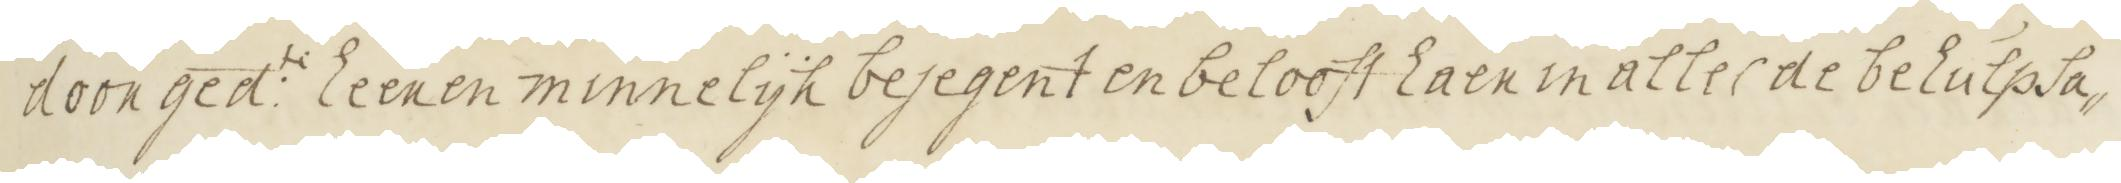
door ged:te heeren minnelijk bejegent en belooft haer in alles de behulpsa„
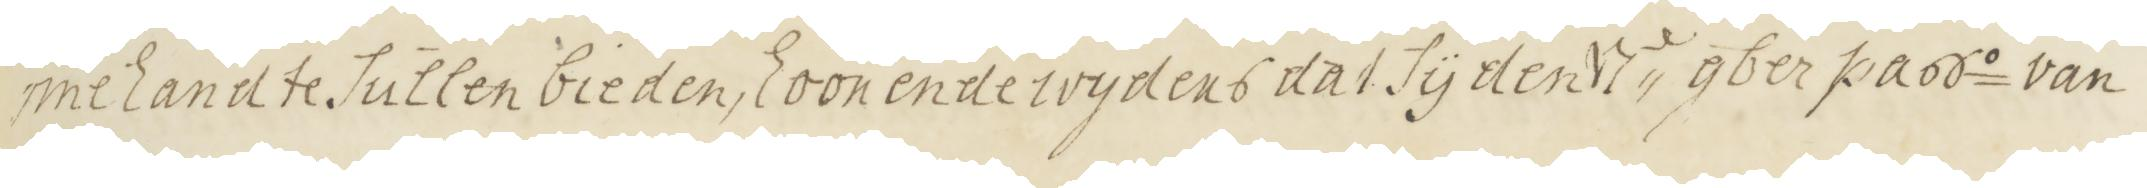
„mehand te sullen bieden, hoor en de wijders dat sij den 17„e gber pass=o van
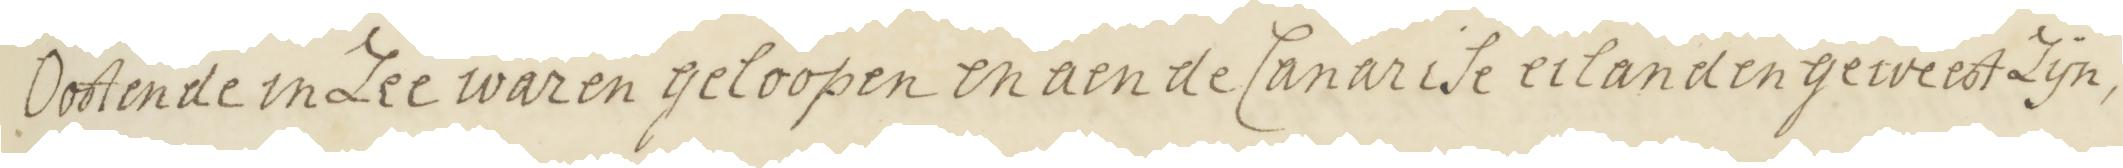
Oostende in zee waren geloopen en aen de Canarise eilanden geweest zijn,
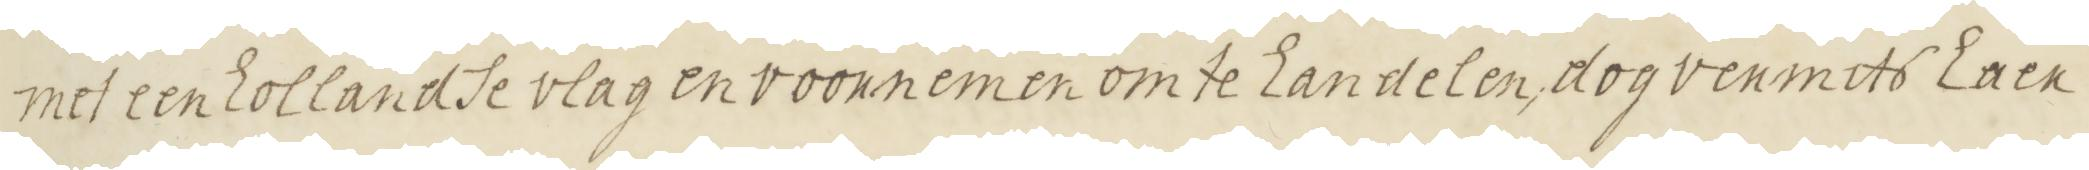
met een hollandse vlag en voornemen om te handelen, dog vermits haer
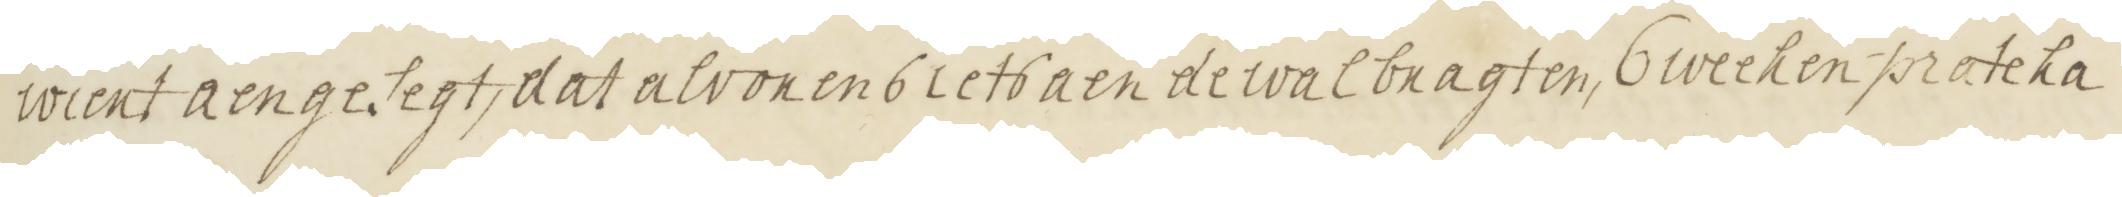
wiert aengesegt, dat alvoren 6 lets aen de wal bragten, 6 weeken proteka
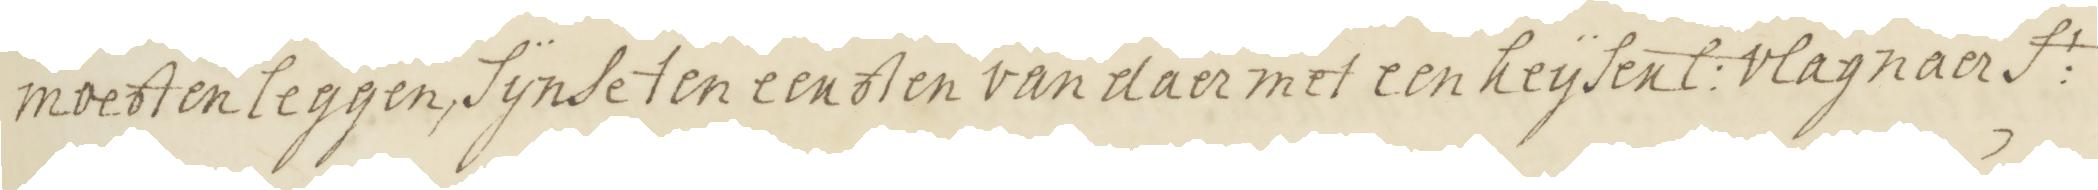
moesten leggen, sijnse ten eersten van daer met een keijsert: vlagnaer s:t
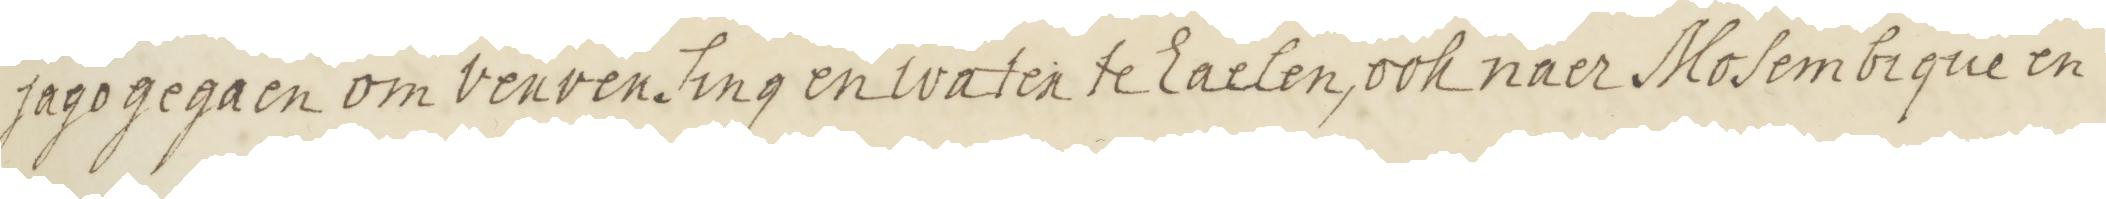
jago gegaen om vervensing en water te haelen, ook naer Mosembique en
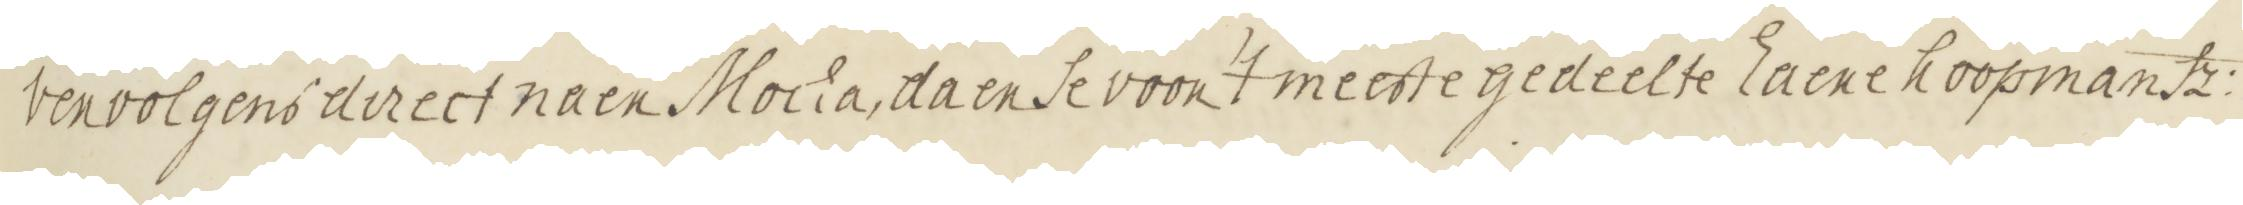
vervolgens direct naer Mocha, daerse voor ’t meerte gedeelte haere koopmansz:
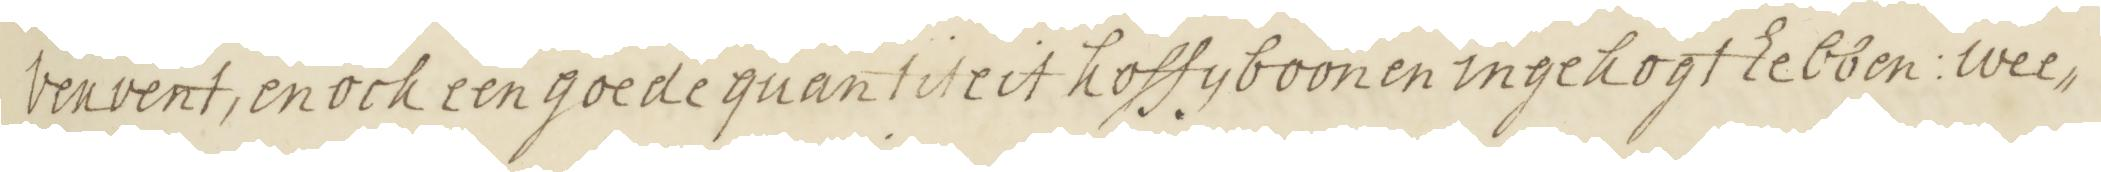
vervent, en ock een goede quantiteit koffijboon en ingekogt hebben: wee„
